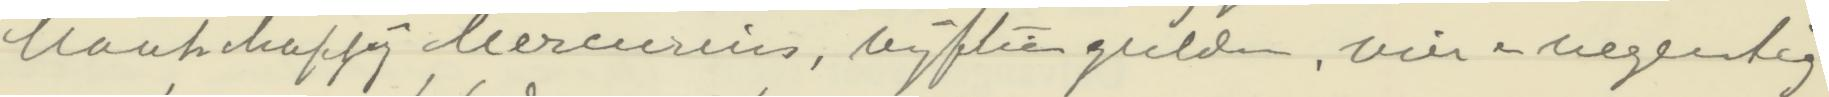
Maatschappij Mercurius, vijftien gulden, vier en negentig
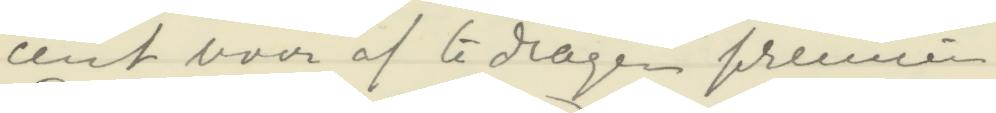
cent voor af te dragen premien
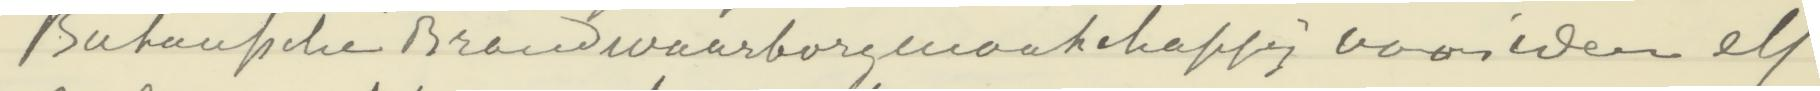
Bataafsche Brandwaarborgmaatschappij voor idem elf
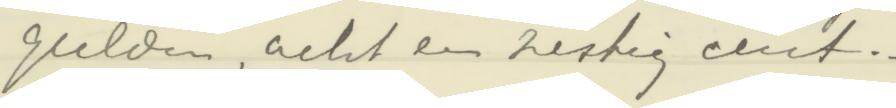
Gulden, acht en zestig cent.
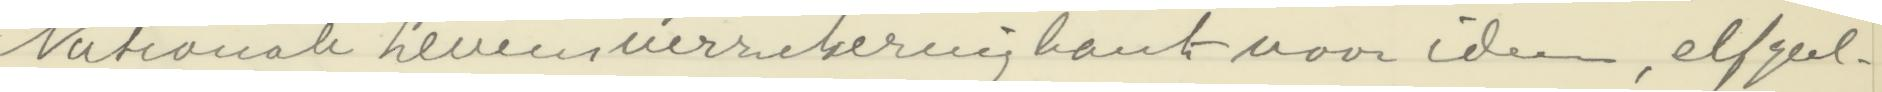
Nationale Levensverzekeringsbank voor idem, elf gul„
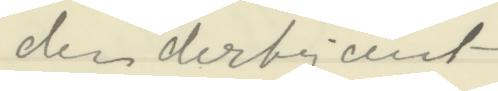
den dertig cent
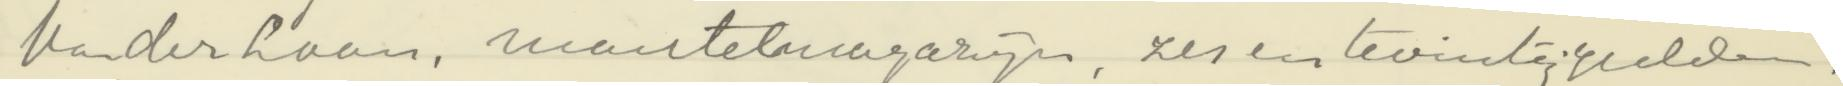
Van der Laar, mantelmagazijn, zes en twintig gulden.
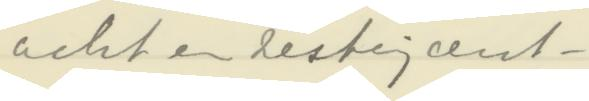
acht en zestig cent-
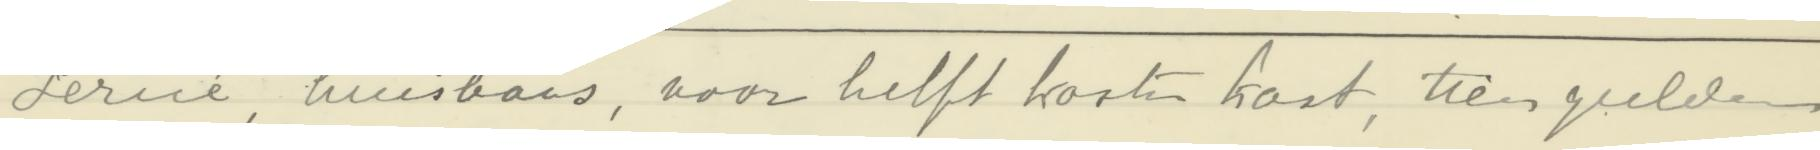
Servé, huisbaas, voor helft kosten kast, tien gulden
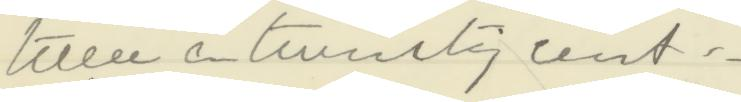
twee en twintig cent.
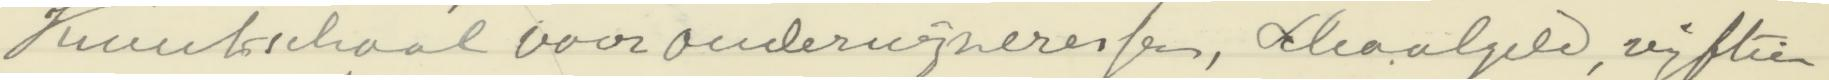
Kweekschool voor onderwijzeressen, schoolgeld, vijftien
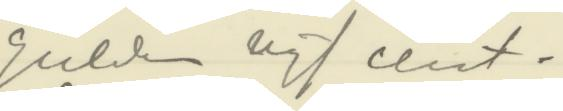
Gulden vijf cent.
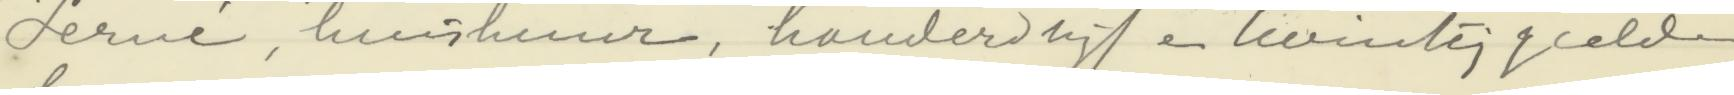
Serné, huishuur, honderd vijf en twintig gulden
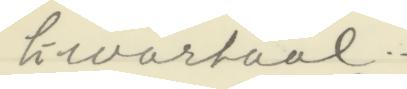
kwartaal.
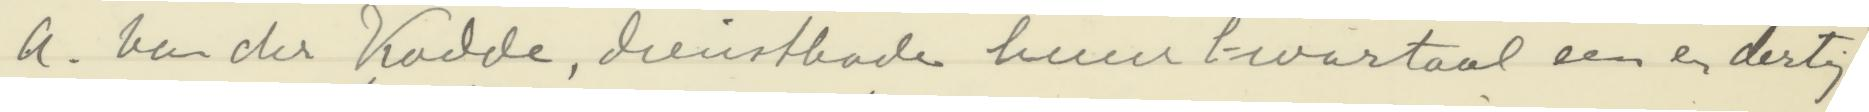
A. van der Kadde, dienstbode huur kwartaal een en dertig
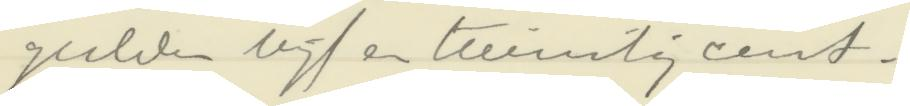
gulden vijf en twintig cent.
